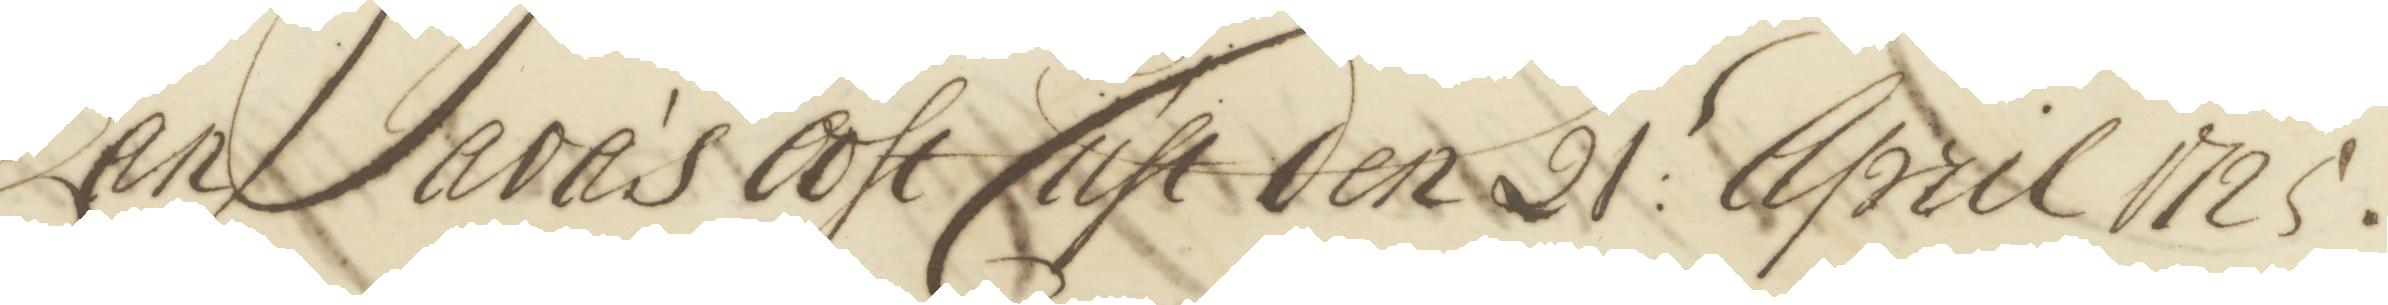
Van Iava's Oost Cust den 21:' April 1725.
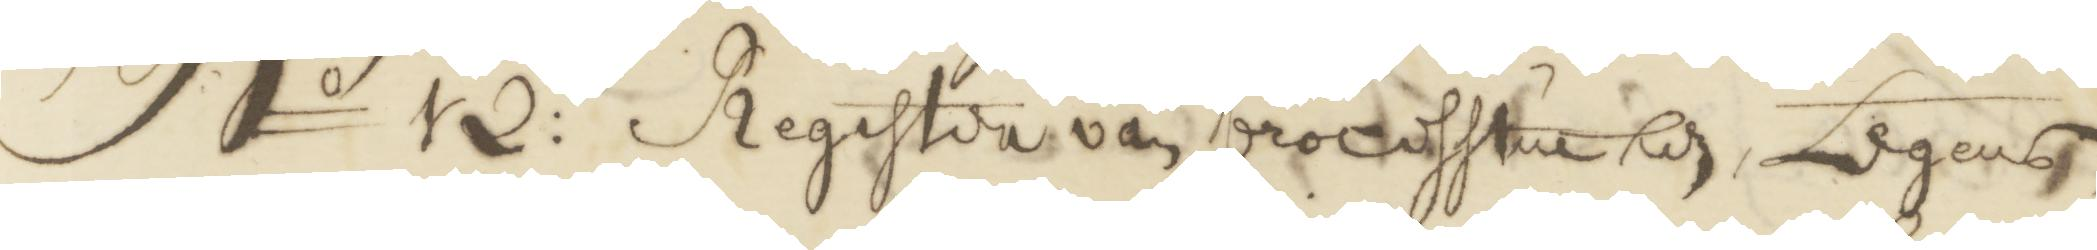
N=o 12: Register van Processtucken, tegens
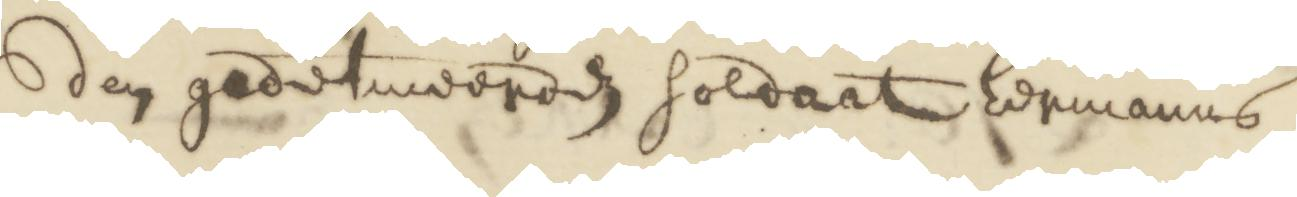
den gedetineerden soldaat hermanus
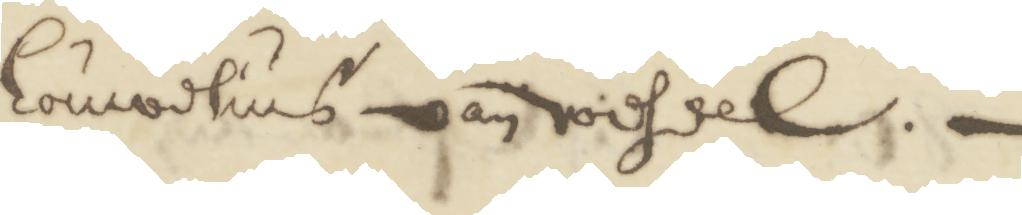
houwelius van Weseel. —
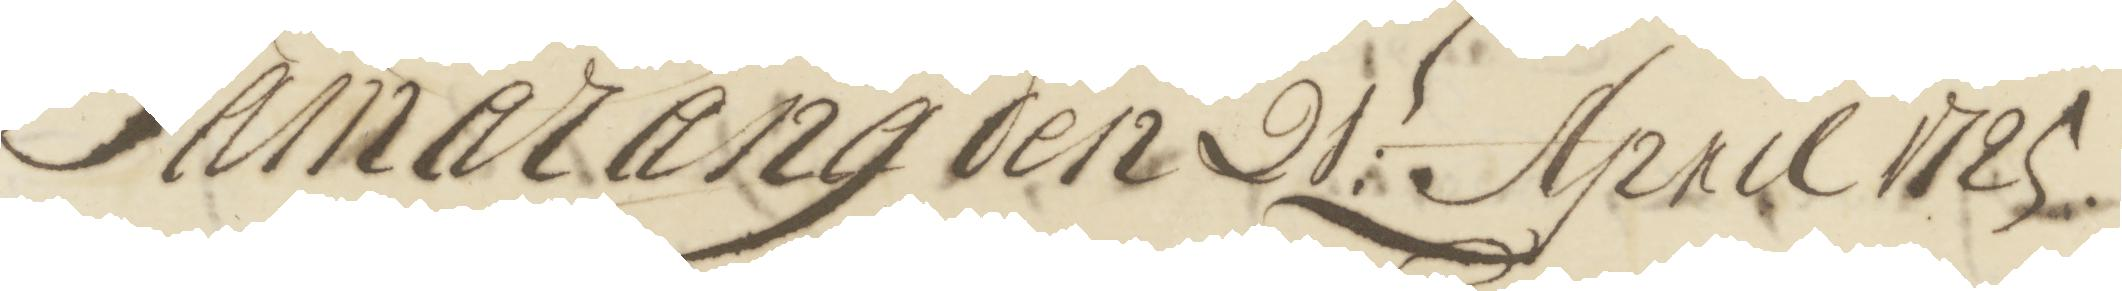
Samarang den 21:' April 1725.
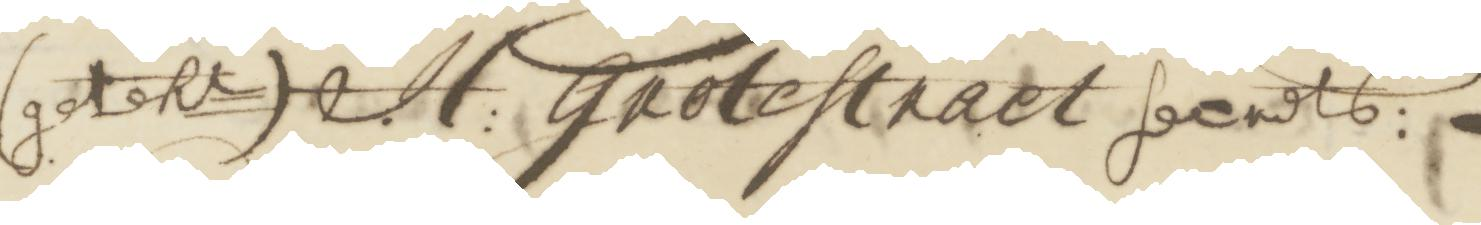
getek=t) H: grotestraet secrets: —
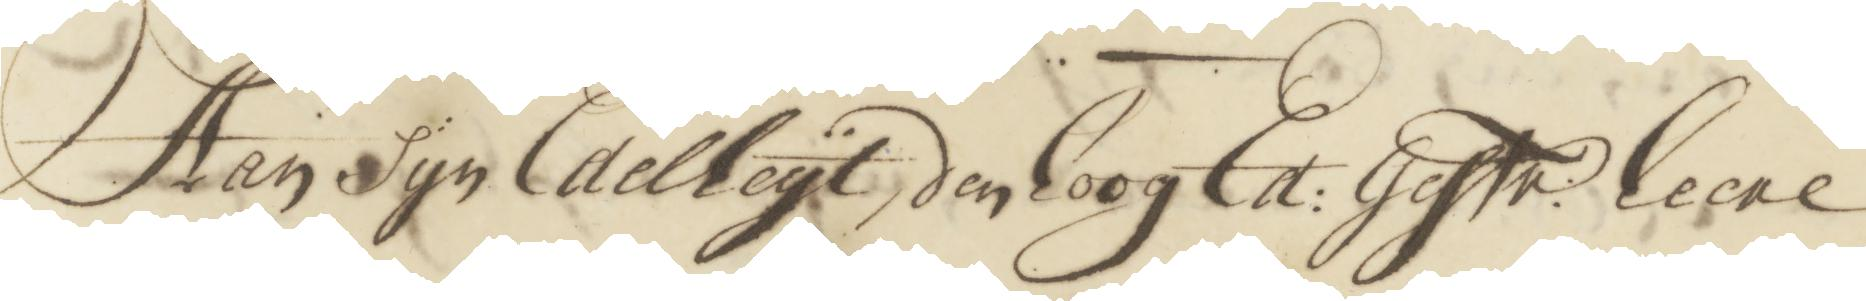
Aan sijn Edelheijt, den hoog Ed: Gestr: heere
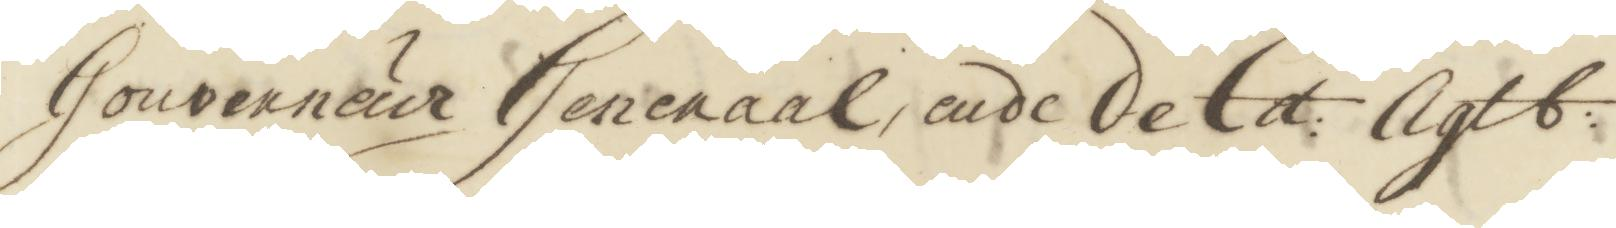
Gouverneur Generaal, ende de Ed: Agtb:
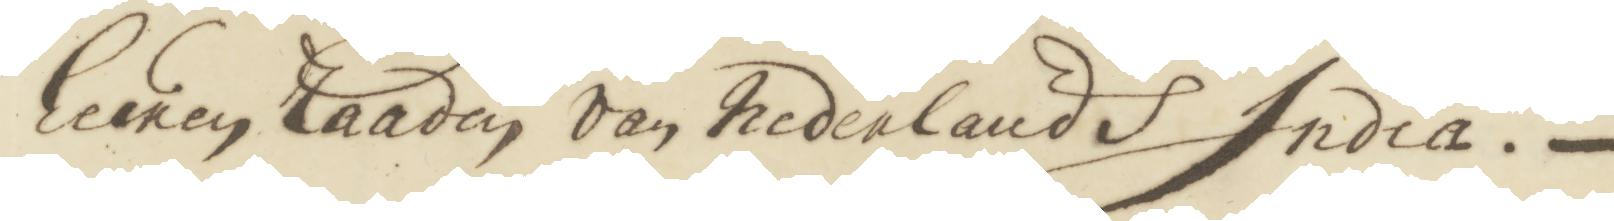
heeren Raaden van Nederlands Jndia. —
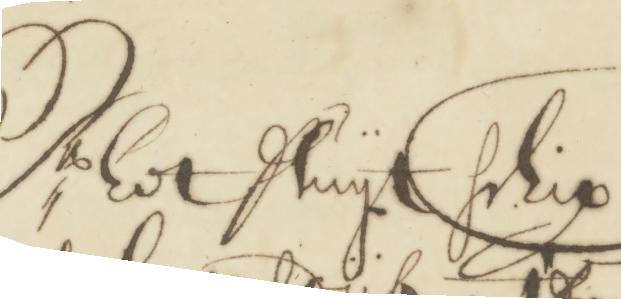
P„r het fluijt schip
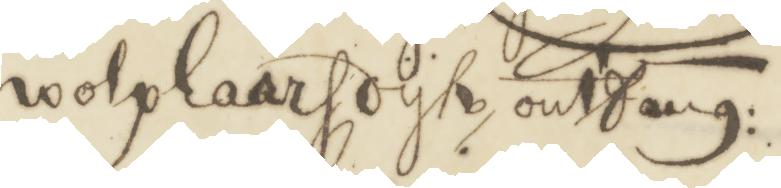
wolphaarsdijk, ontfang:
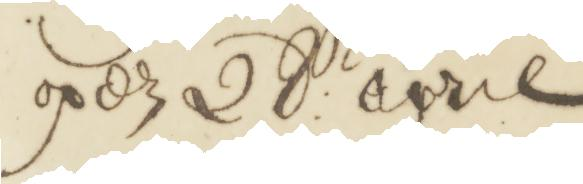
op den 28:' april
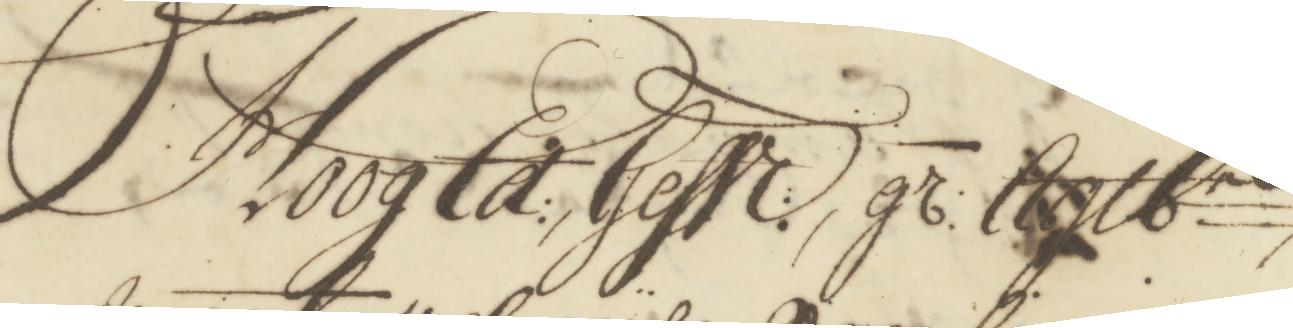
Hoog Ed:, Gestr:, gr: Agtb=re,
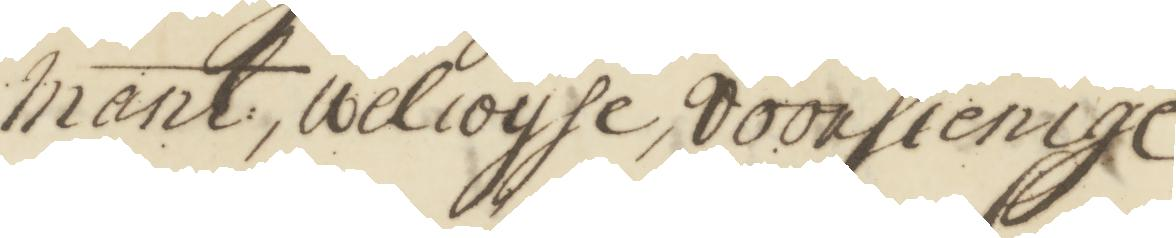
manh:, welwijse, voorsienige
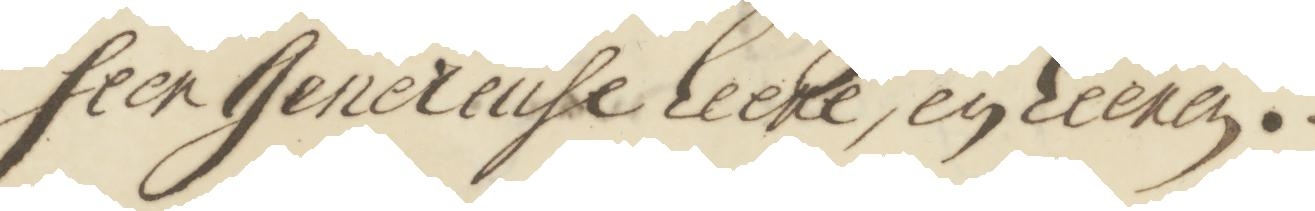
seer Genereuse heere, en heeren.
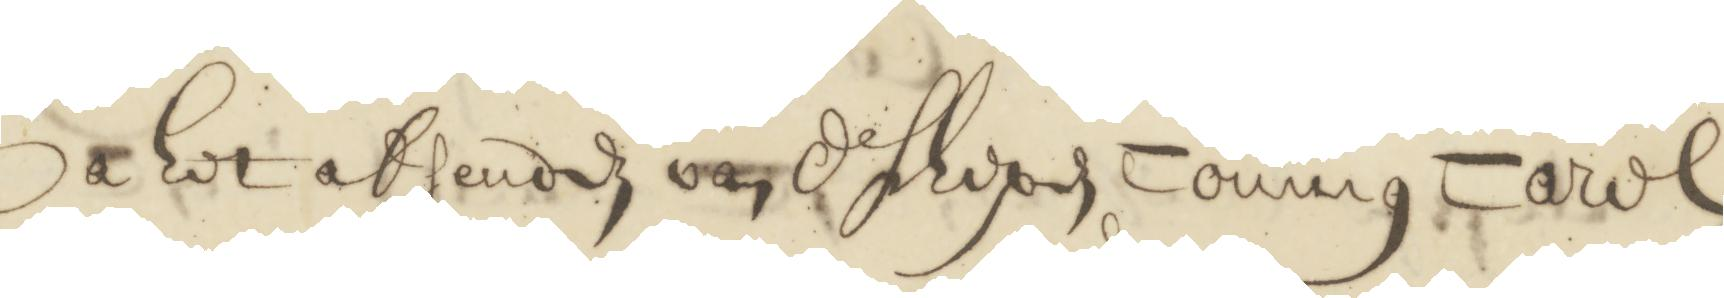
Na het afsenden van de schepen Coning Carel,
